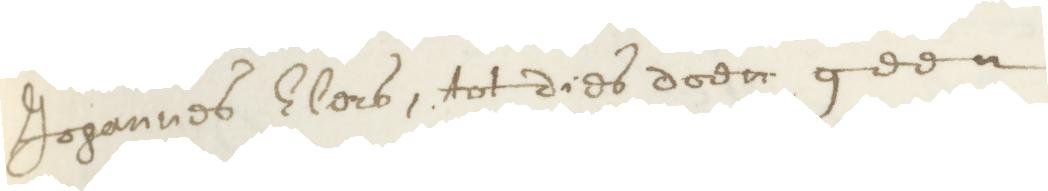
Johannes Elors, tot dies doen geen
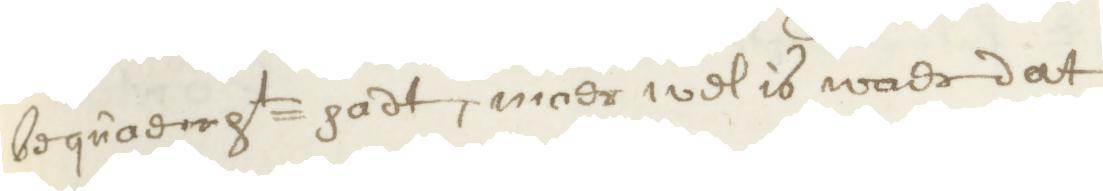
bequaemh=t hadt, maer wel is waer dat
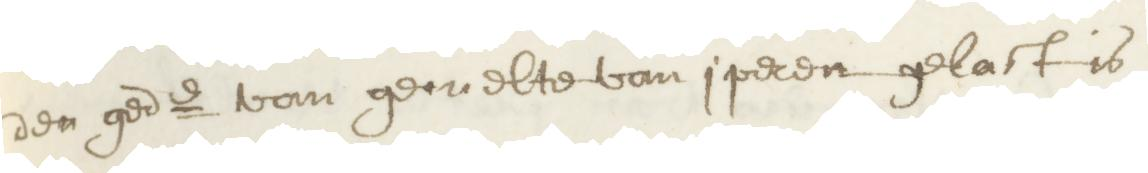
den ged=e van gemelte van jperen gelast is
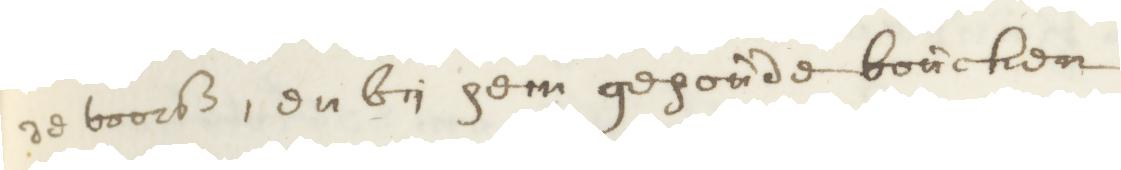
de voorsz, en bij hem gehoude boucken
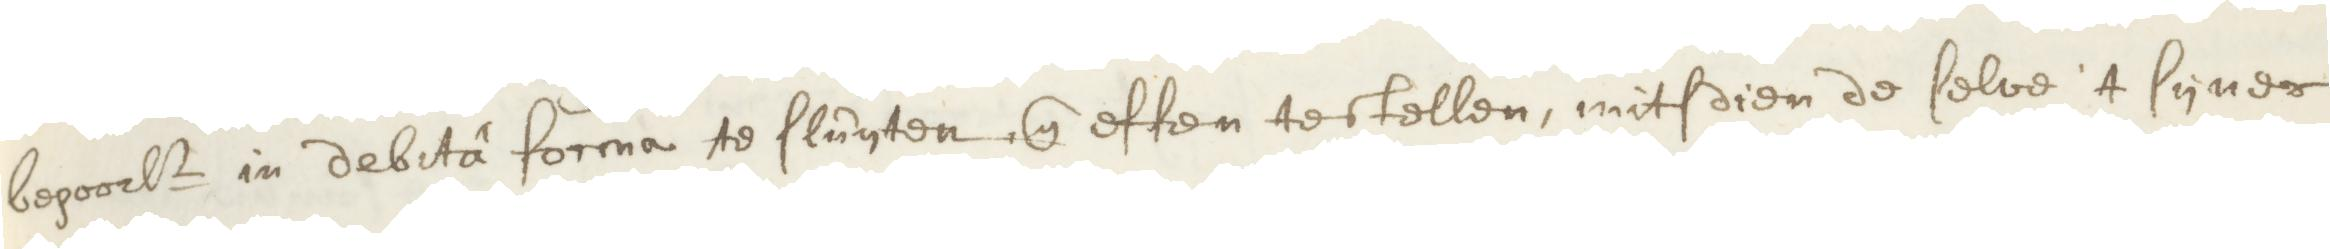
behoorlijk in debita forma te sluijten ende effen te stellen, mitsdien de selve ’t sijner
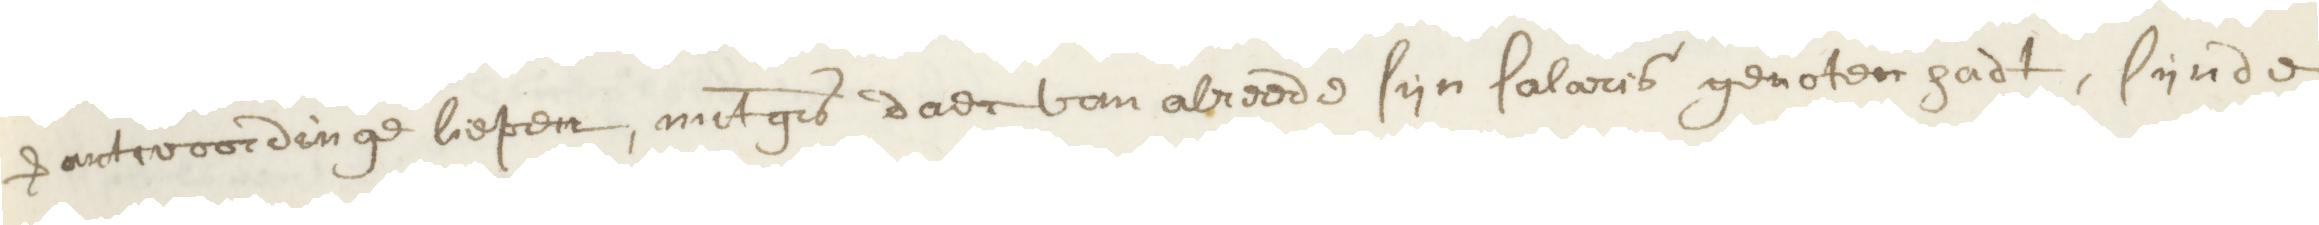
verantwoordinge liepen, mitgrs daer van alreede sijn salaris genoten hadt, sijnde
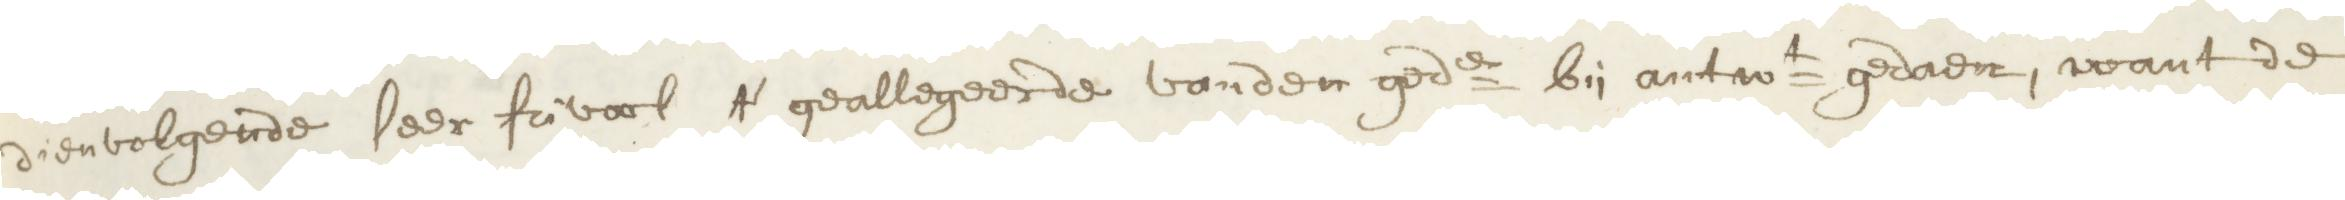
dienvolgende seer frivool t' geallegeerde van den ged=e bij antw=t gedaen, want de
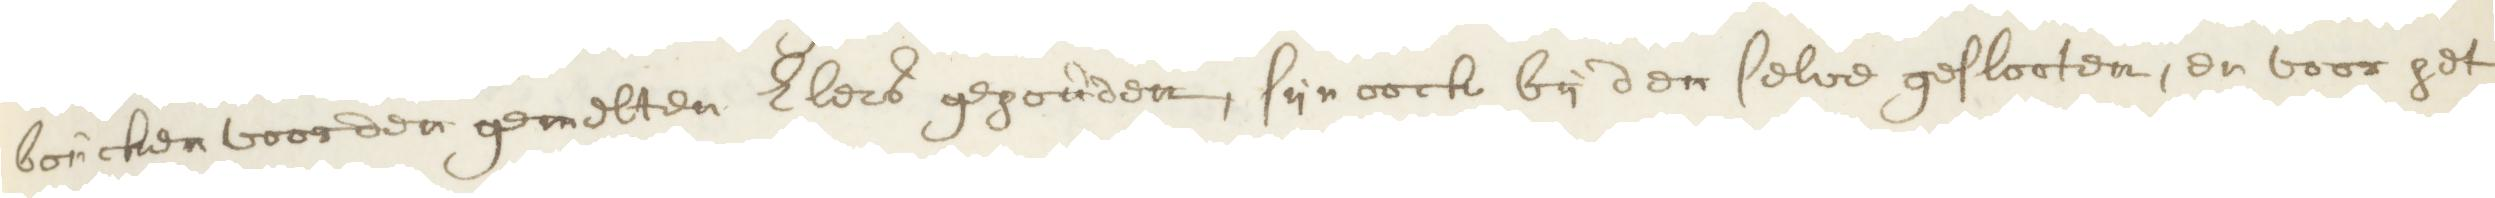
boucken voor den gemelten Elers gehouden, sijn oock bij den selve geslooten, en voor het
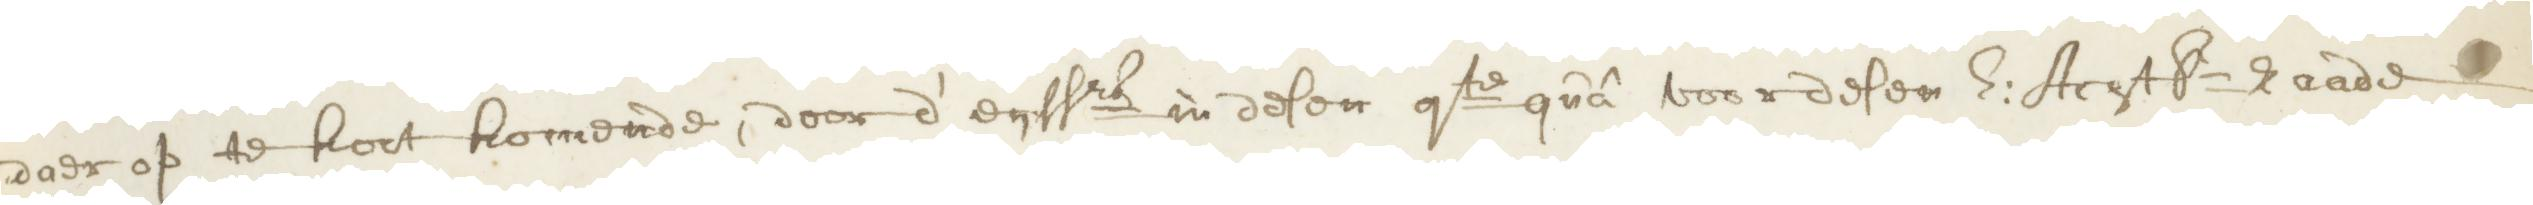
daer op te kort komende, door d’ eijss=rs in desen q=te quâ voor desen E: Achtb= raade
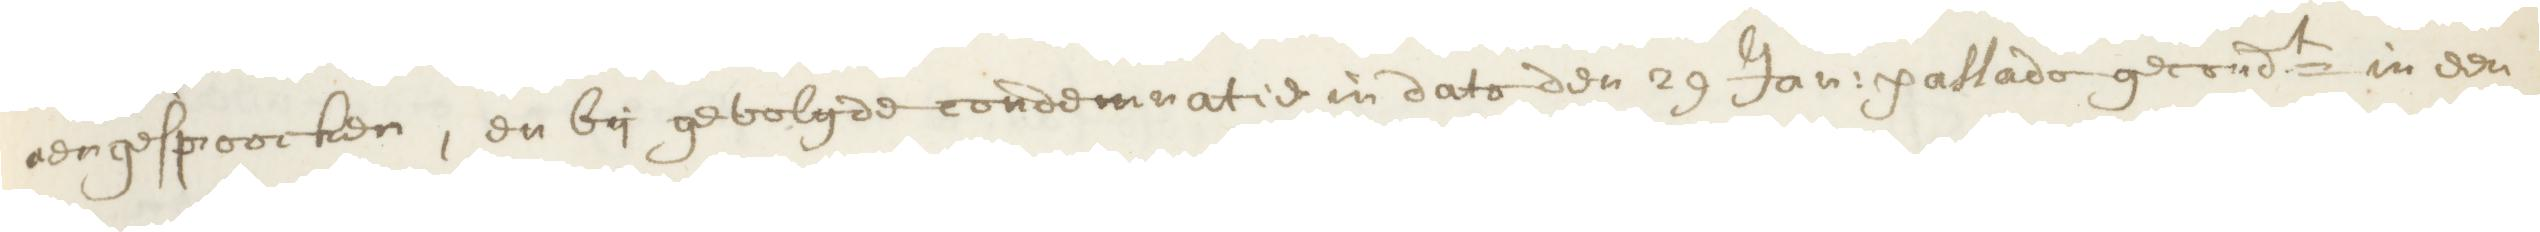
aengespoocken, en bij gevolgde condemnatie in dato den 29 Jan: passado gecond=t in een
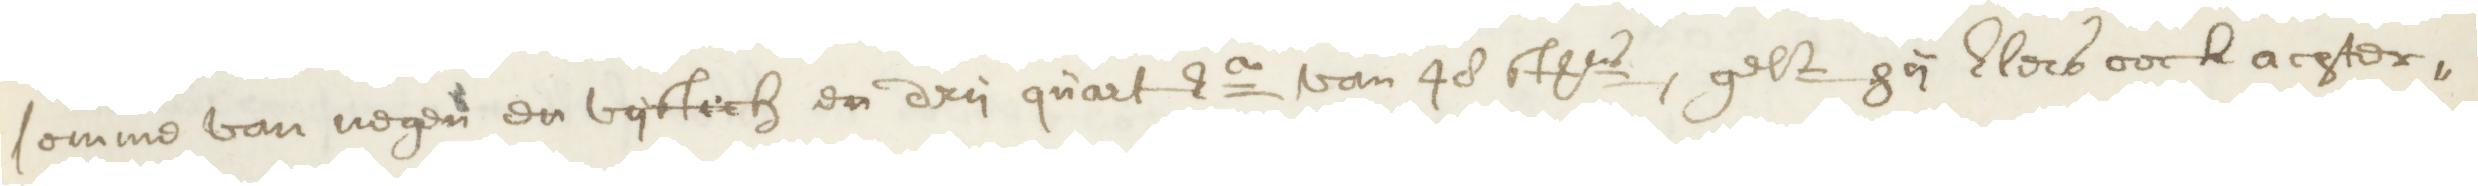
somme van negen en vijftich en drij quart r=a van 48 stver=s, gelt hen Elers oock achter„
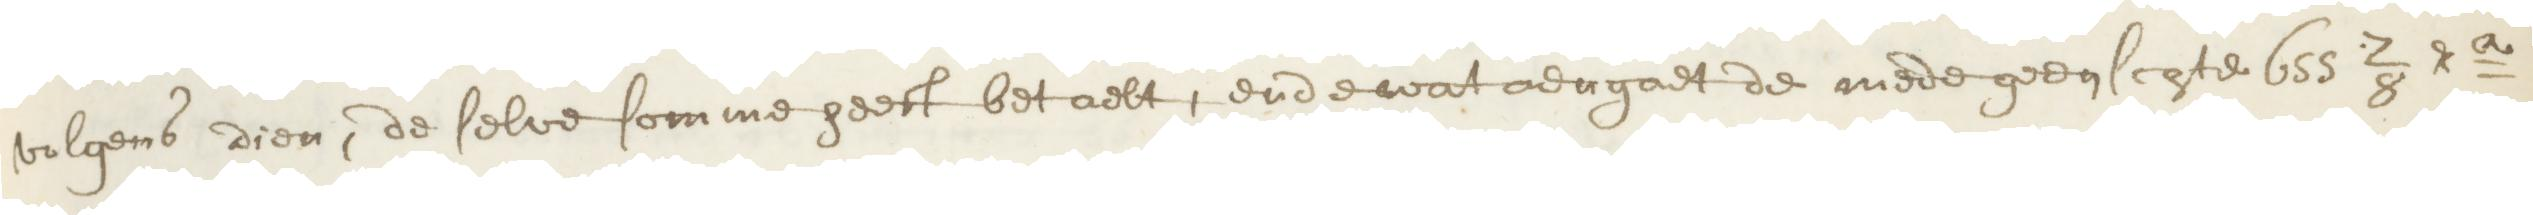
volgens dien, de selve somme heeft betaelt, ende wat aengaet de mede geeyschte 655 7/8 r=a
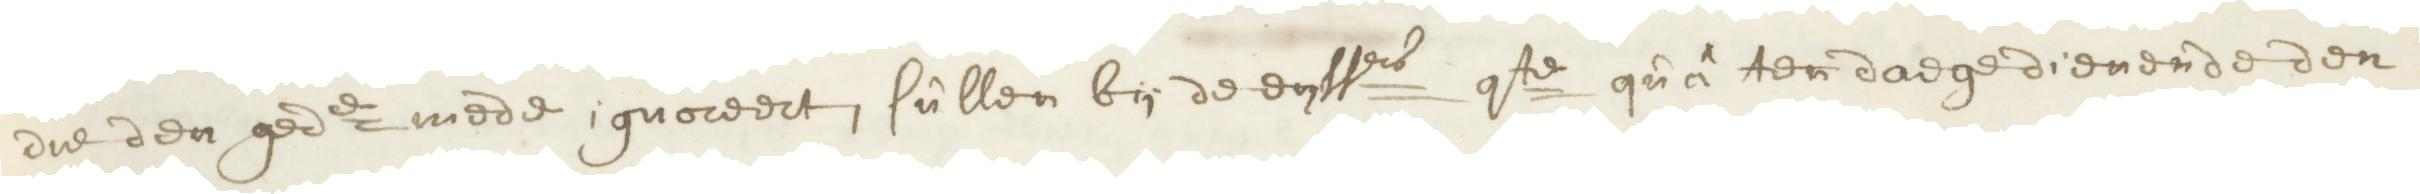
die den ged=e mede ignoreert, sullen bij de eyss=rs q=te quâ ten daege dienende den
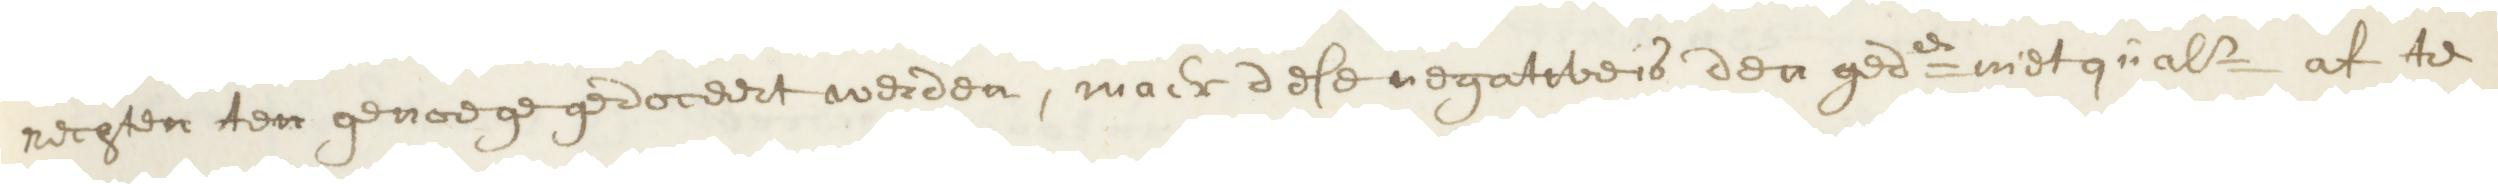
rechter ter genoege gedoceert werden, maer dese negative is den ged=es niet qualijk af te
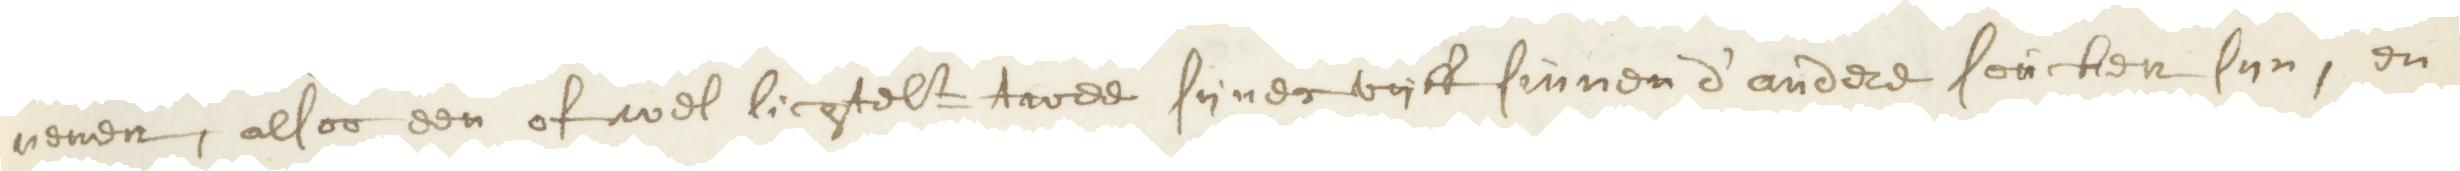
nemen, alsoo een of wel lichtelijk twee sijner vijff sinnen d’andere soucken syn, en
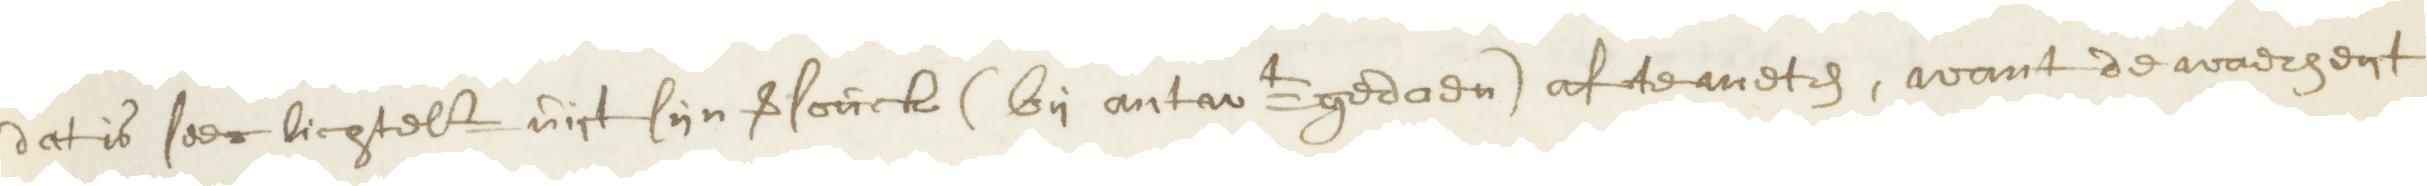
dat is seer lichtelijk uijt sijn versouck (bij antw=t gedaen) af te meten, want de waerheyt
